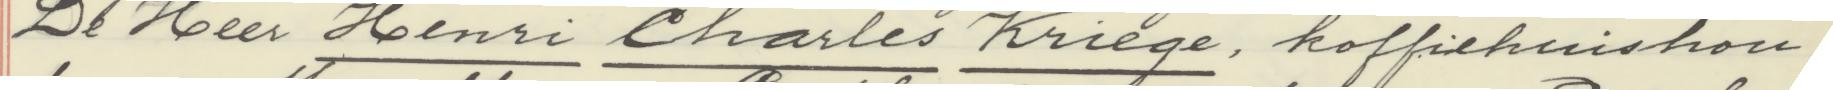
De Heer Henri Charles Kriege, koffiehuishou
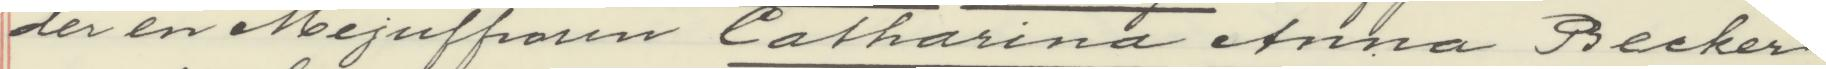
der en Mejusfouw Catharina Anna Becker
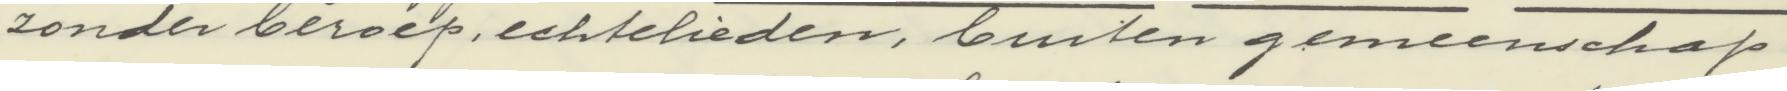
zonder beroep, echtelieden, buiten gemeenschap
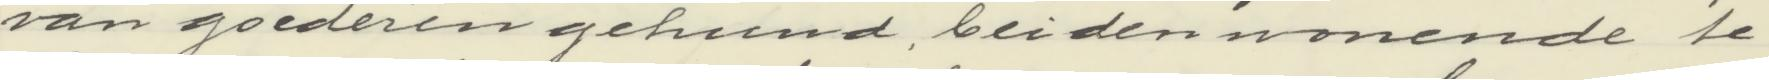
van goederen gehuwd beiden wonende te
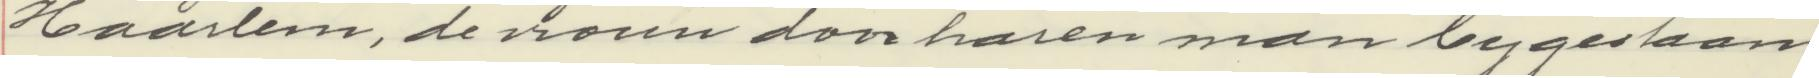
Haarlem, de vrouw door haren man bygestaan
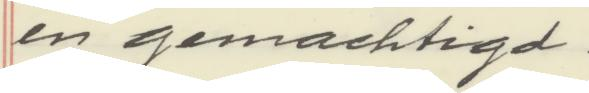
en gemachtigd
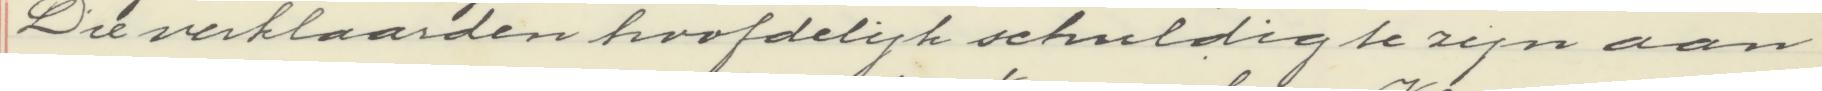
Die verklaarden hoofdelijk schuldig te zijn aan
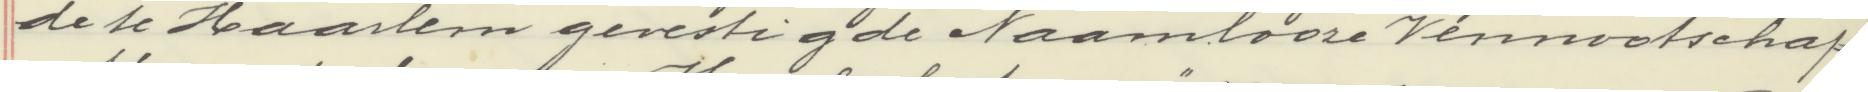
de te Haarlem gevestigde Naamlooze Vennootschap
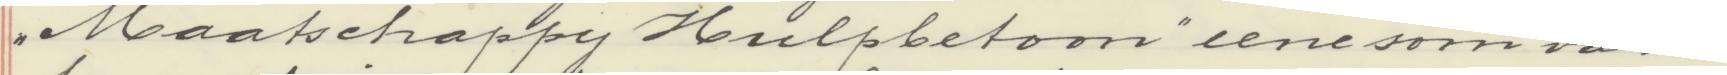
„ Maatschappy Hulpbetoon " eene som van
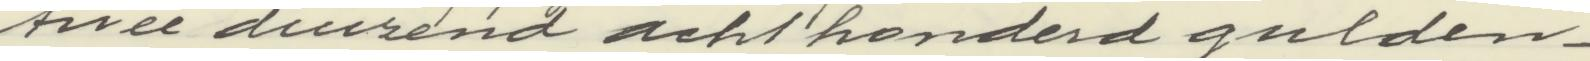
twee duizend acht honderd gulden
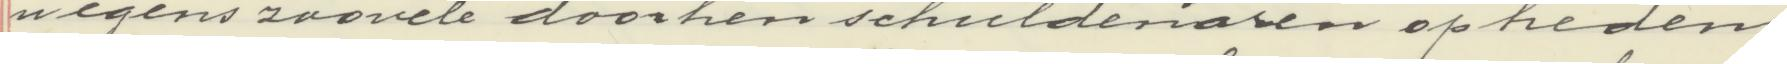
wegens zoovele door hen schuldenaren opheden
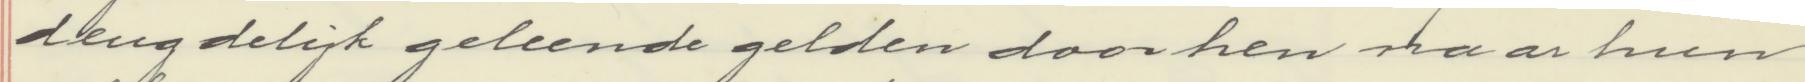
deugdelijk geleende gelden door hen naar hun
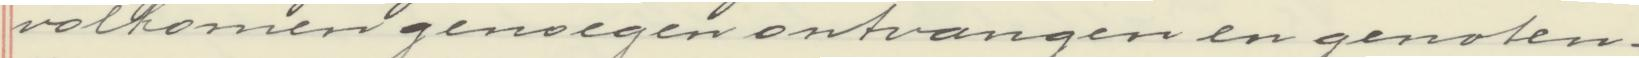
volkomen genoegen ontvangen en genoten
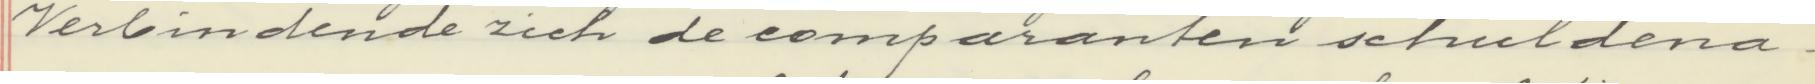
Verbindende zich de comparanten schuldena
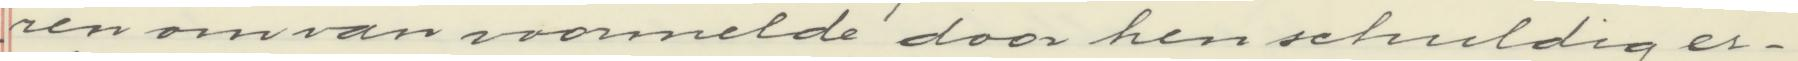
ren om van voormelde door hen schuldig er-
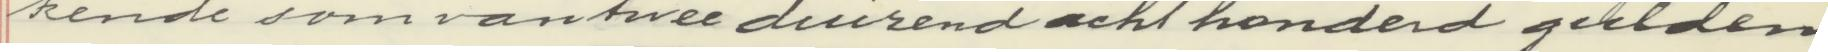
kende som van twee duizend acht honderd gulden
